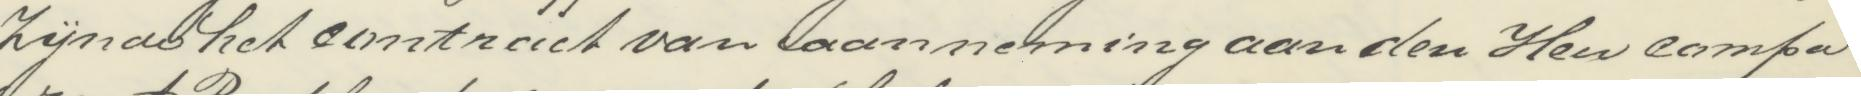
zijnde het contract van aanneming aan den Heer compa
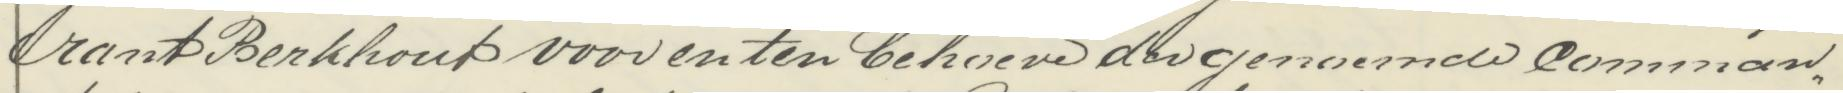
rant Berkhout voor en ten behoeve der genoemde comman„
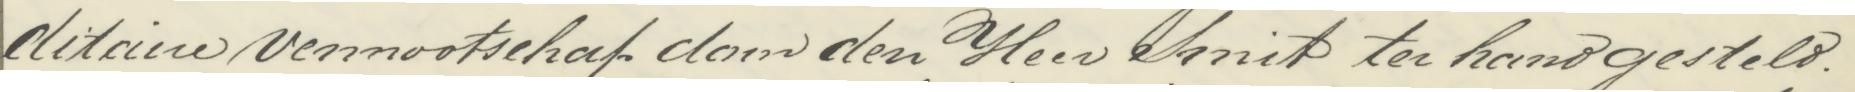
ditoire vennootschap door den Heer Smit ter hand gesteld.
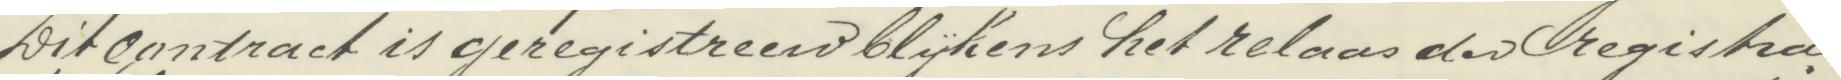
Dit contract is geregistreerd blijkens het relaas der Registra
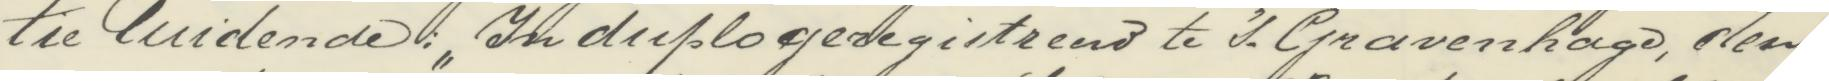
tie luidende: „ In duplo geregistreerd te 's-Gravenhage, den
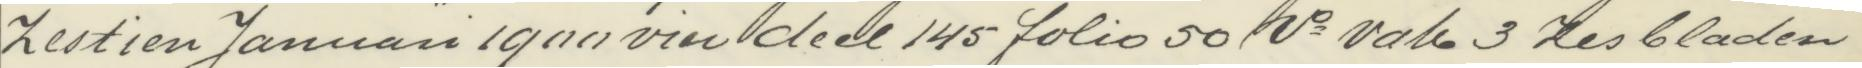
zestien Januari 1900 vier deel 145 folio 50 v=o vak 3 zes bladen
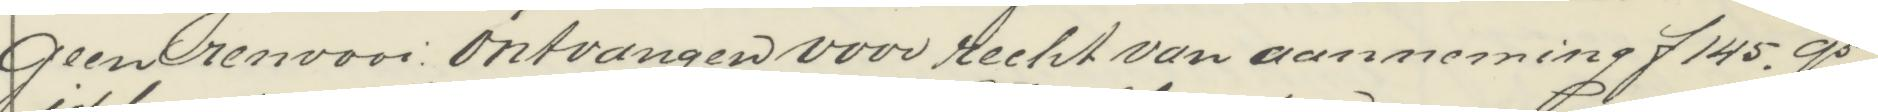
geen renvooi: ontvangen voor recht van aanneming ƒ 145.95
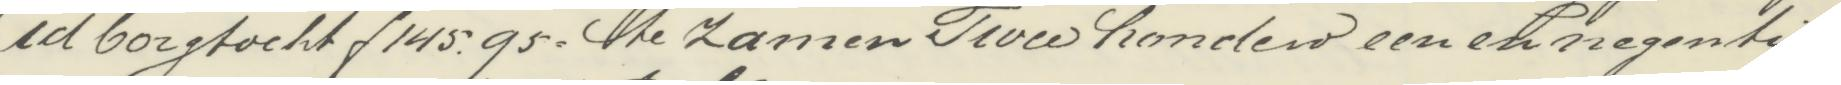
id borgtocht ƒ 145.95= te zamen Twee honderd een en negentig
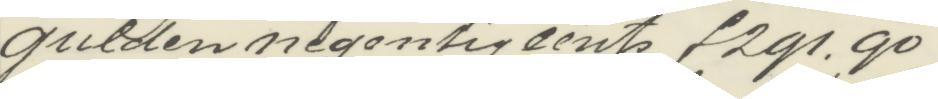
gulden negentig cents ƒ291.90
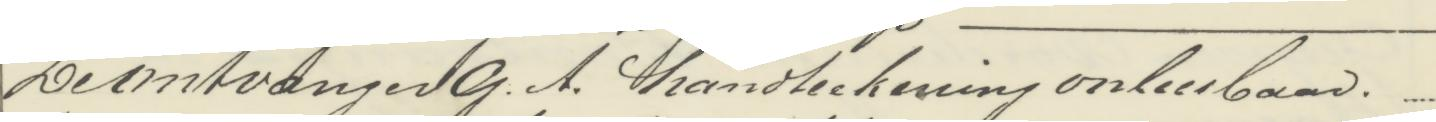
De ontvanger G. A. handteekening onleesbaar.
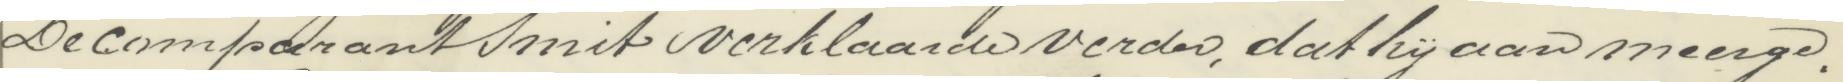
De comparant Smit verklaarde verder, dat hij aan meerge.
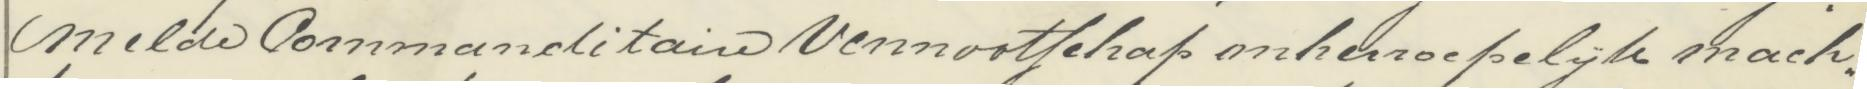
melde Commanditaire vennootschap onherroepelijk mach„
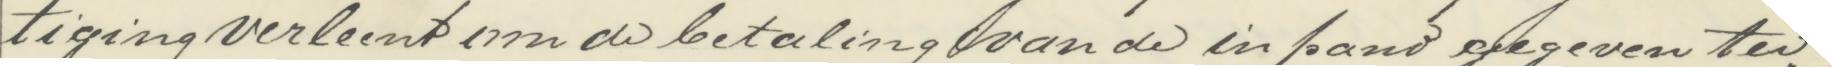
tiging verleent om de betaling van de in pand gegeven ter„
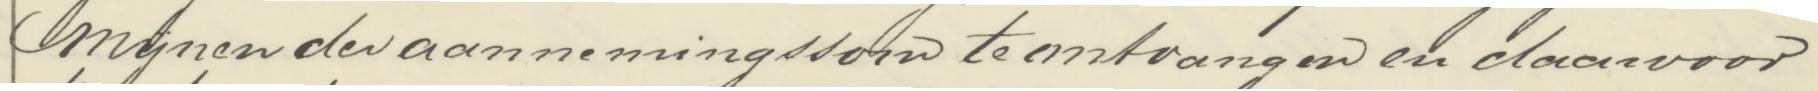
mijnen der aannemingssom te ontvangen en daarvoor
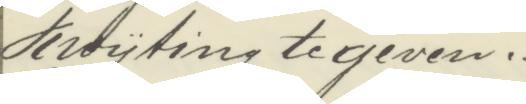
kwijting te geven.
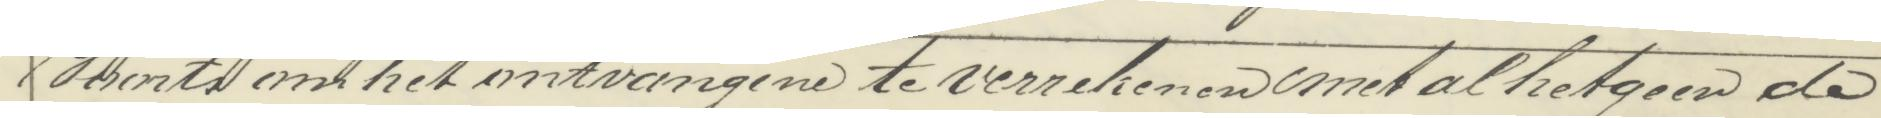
Voorts om het ontvangene te verrekenen met al hetgeen de
